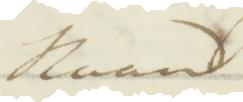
Kaan
